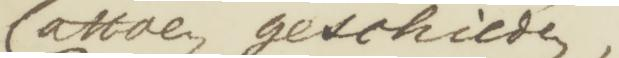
Cattoen geschieden,
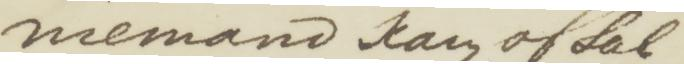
niemand kan of sal
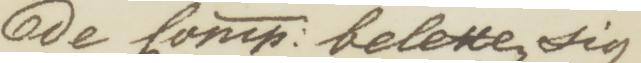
de Comp: beletten sig
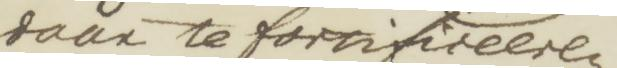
daar te fortificeeren
